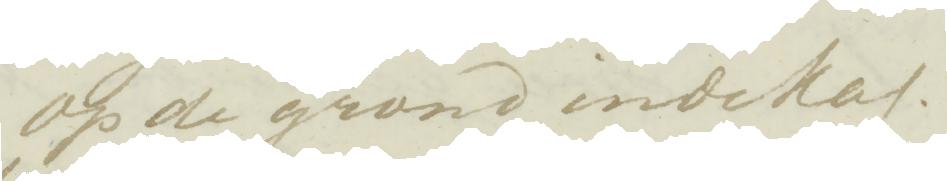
Op de grond indekas.
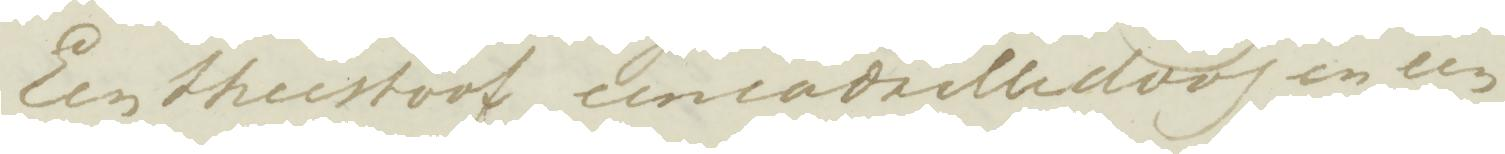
Een theestoof, een cadrilledoos en een
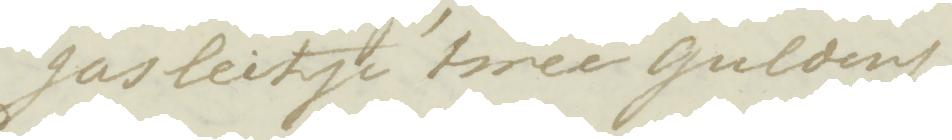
Jasleitje twee guldens
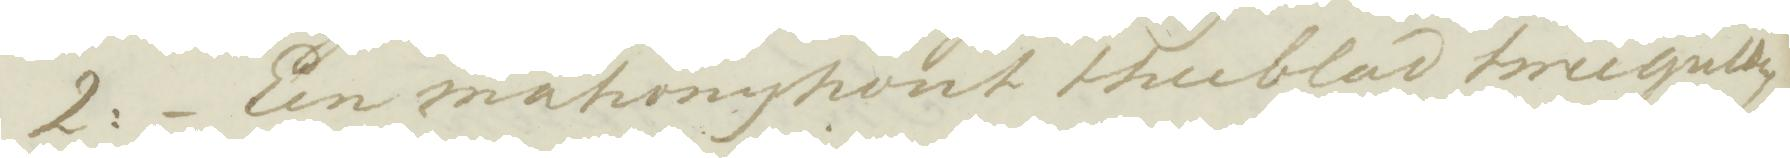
2: — Een mahonijhout thublad twee guldens
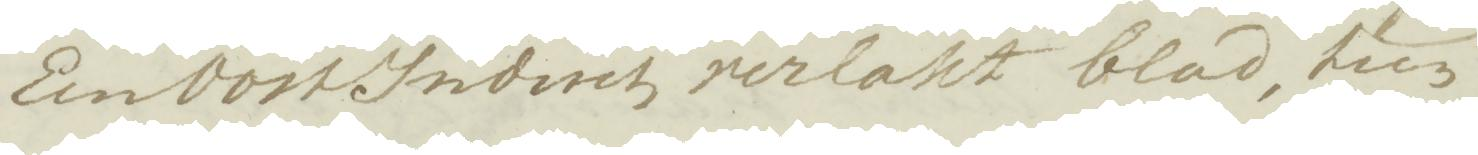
Een OostIndisch verlakt blad, tien
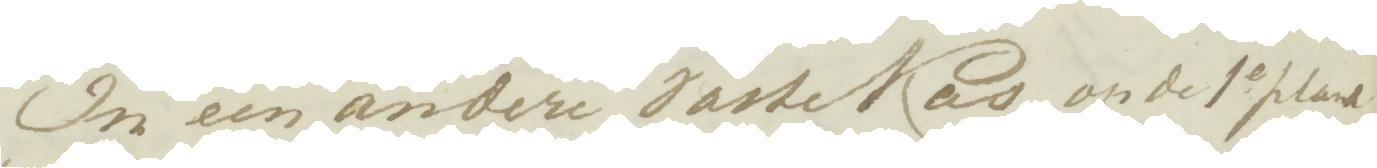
In een andere Vaste Kas. op de 1.e plank
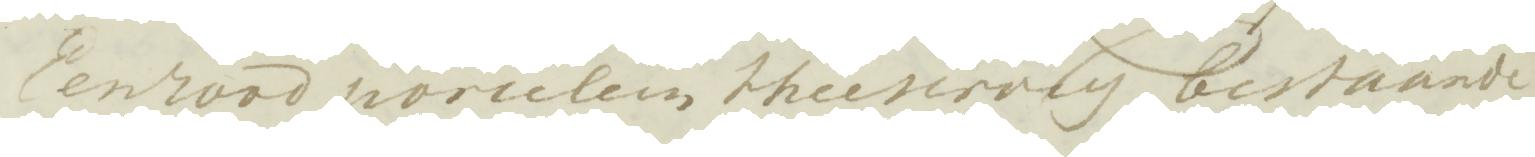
Een rood porcelein theeservies, bestaande
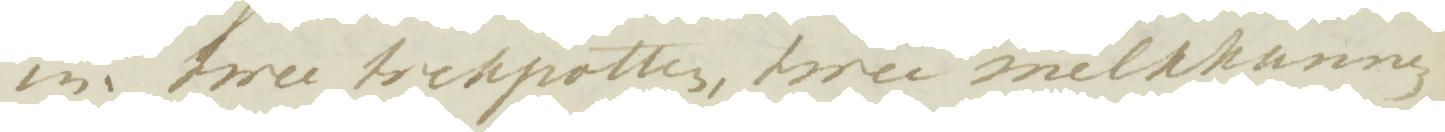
in twee trekpotten, twee melkkannen
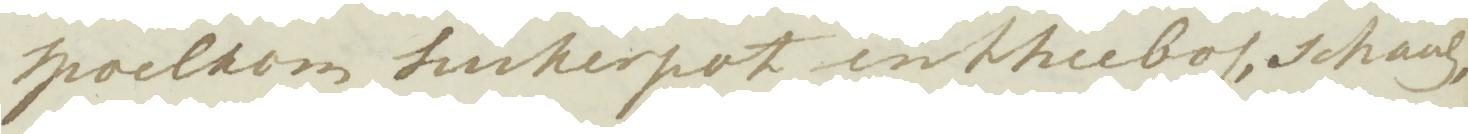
spoelkom suikerpot en theebos, schaal
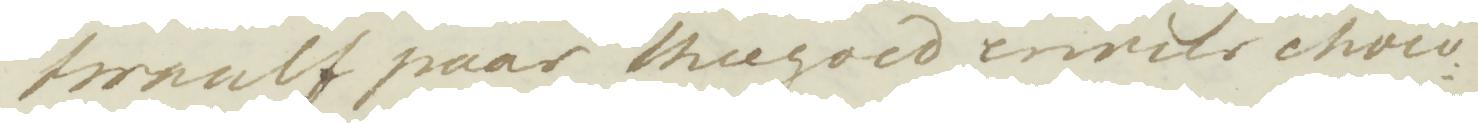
twaalf paar theegoed en vier choco„
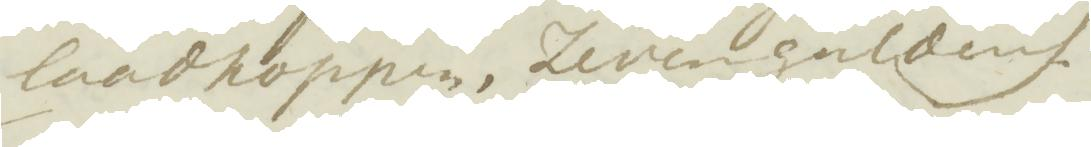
laadkoppen, Zeven guldens.
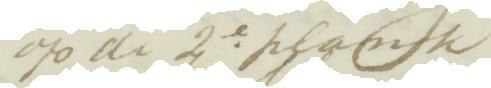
op de 2:e plank
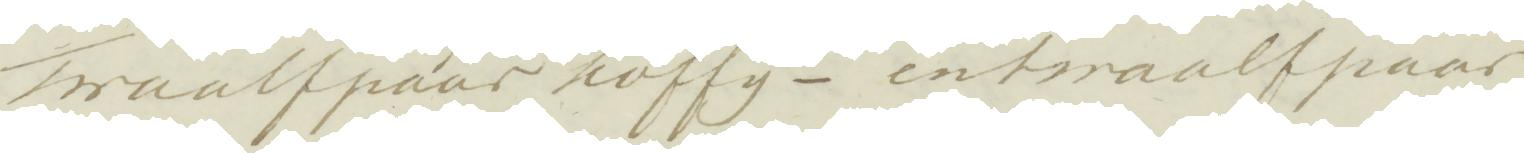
Twaalfpaar koffy - en twaalf paar
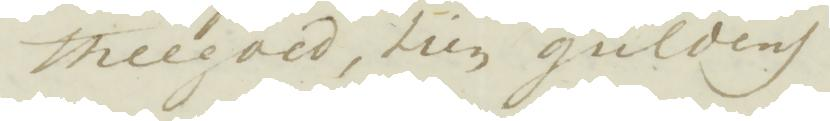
theegoed, tien guldens
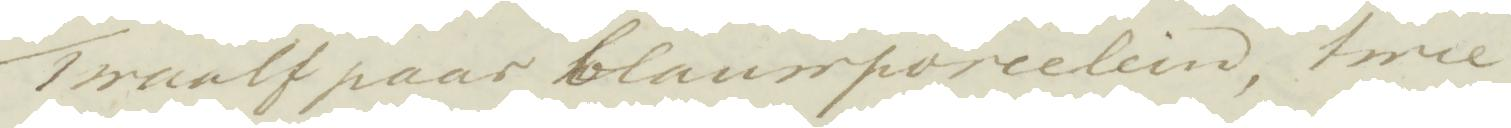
Twaalf paar blauwporeelein, twee
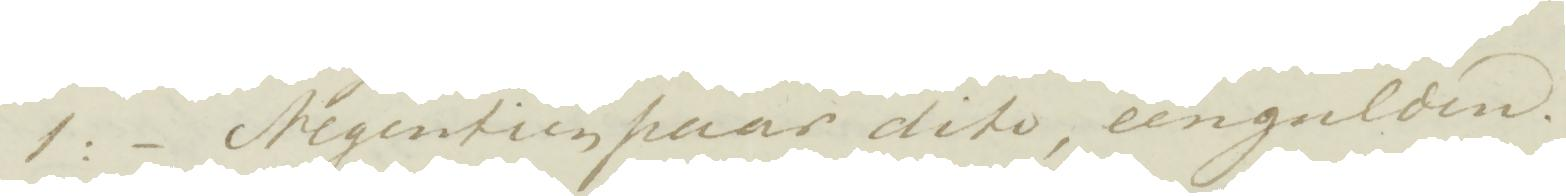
1 : — Negentien paar dito, een gulden.
